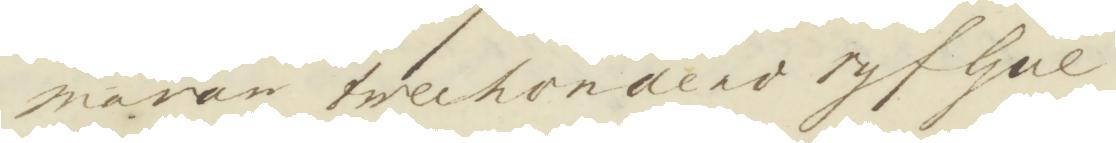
ma van tweehonderd vyf Gul
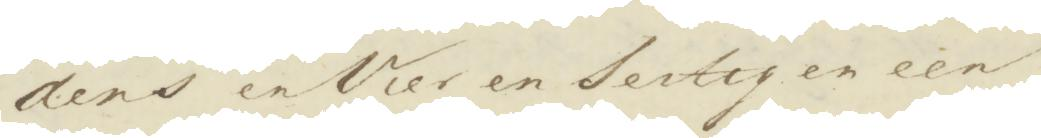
dens en Vier en Sestig en een
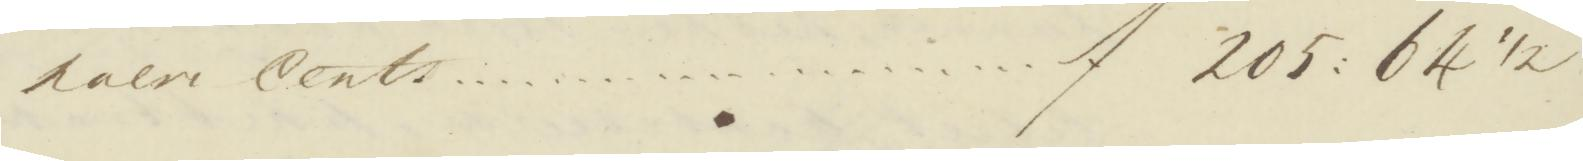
halve Cents . . . . . . . . . . . . . . . . . . . . ƒ 205: 64 ½
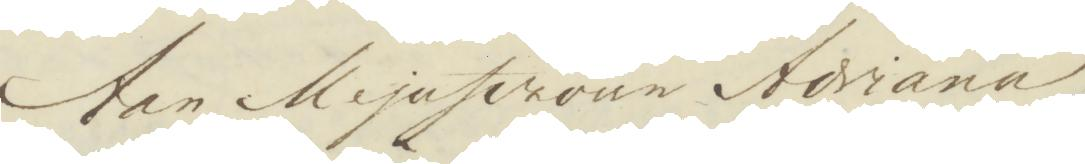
Aan Mejufvrouw Adriana
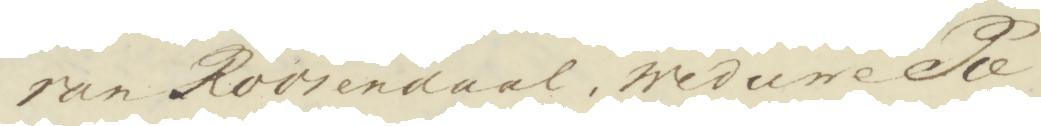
van Roosendaal, weduwe Pie
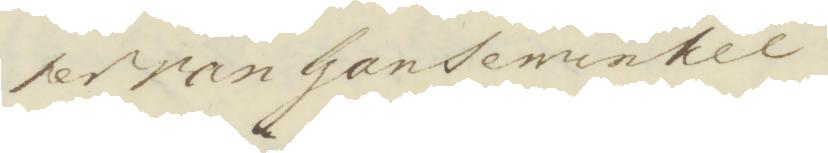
ter van Gansewinkel
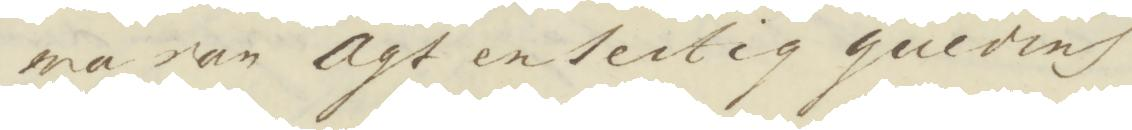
ma van Agt en sestig guldens
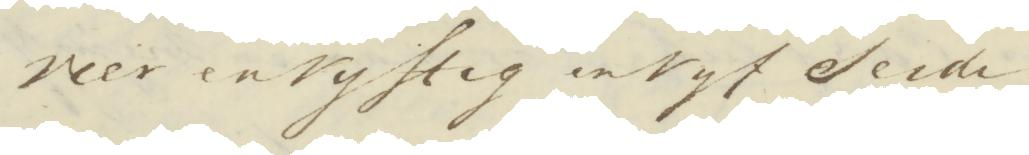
vier en vyftig en vyf sesde
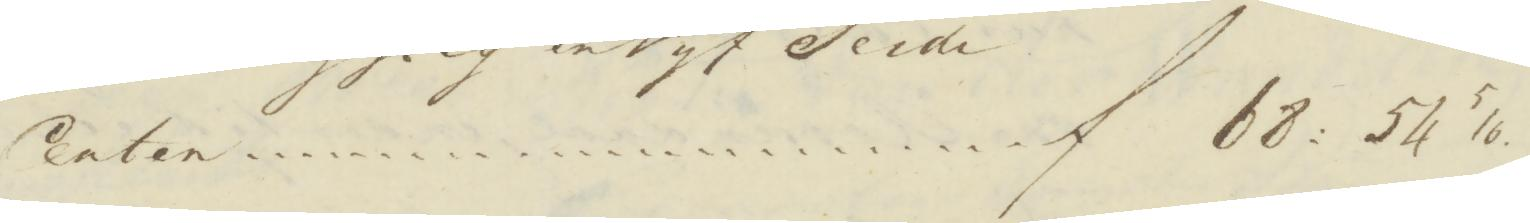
Centen . . . . . . . . . . . . . . . . . . . . . . . . ƒ 68: 54 5/6.
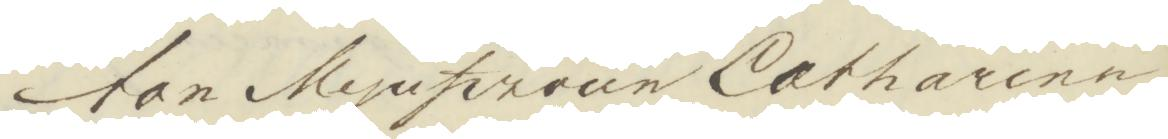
Aan Mejufvrouw Catharina
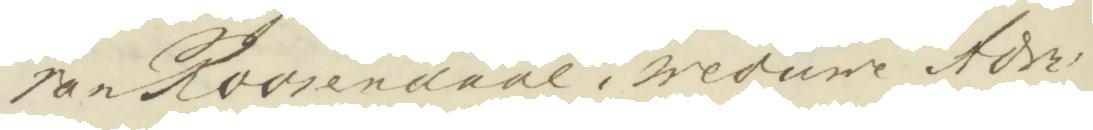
van Roosendaal, weduwe Adri
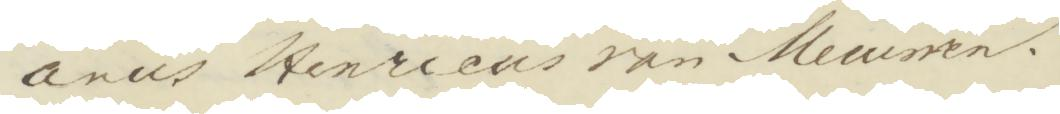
anus Henricus van Meeuwen.
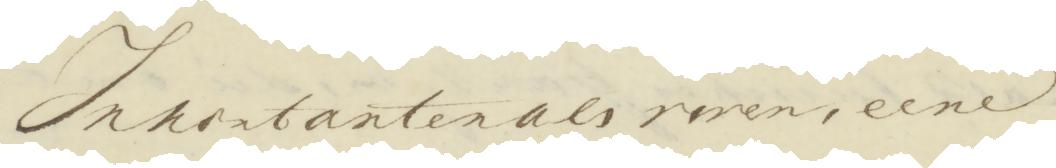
In kontanten als voren, eene
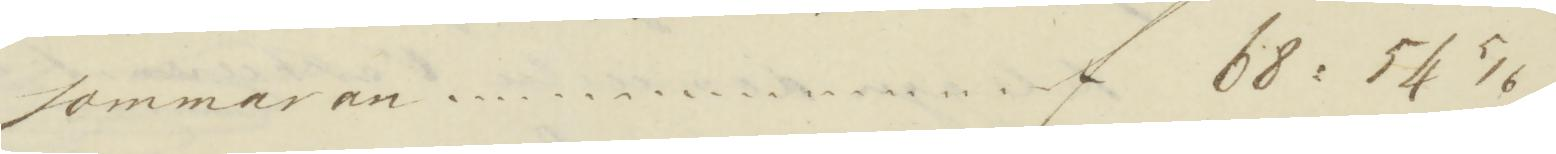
somma van ƒ 68: 54 5/6.
